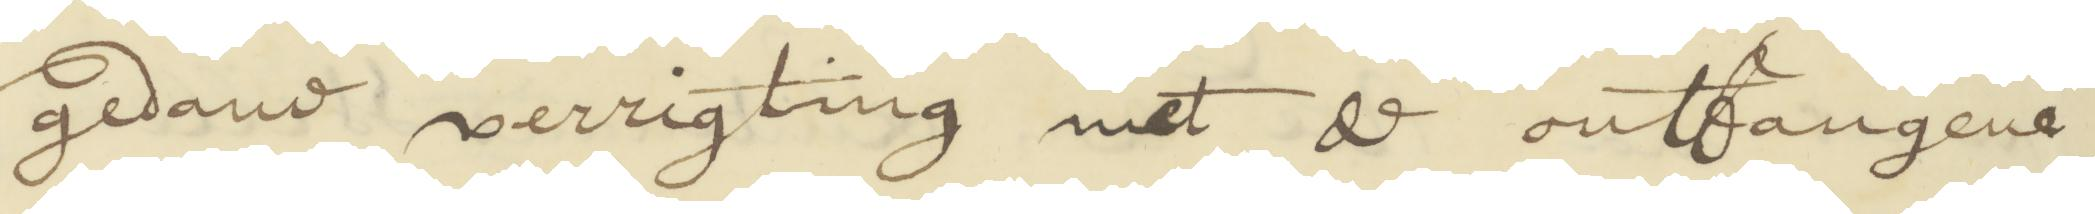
gedane verrigting met de ontfangene
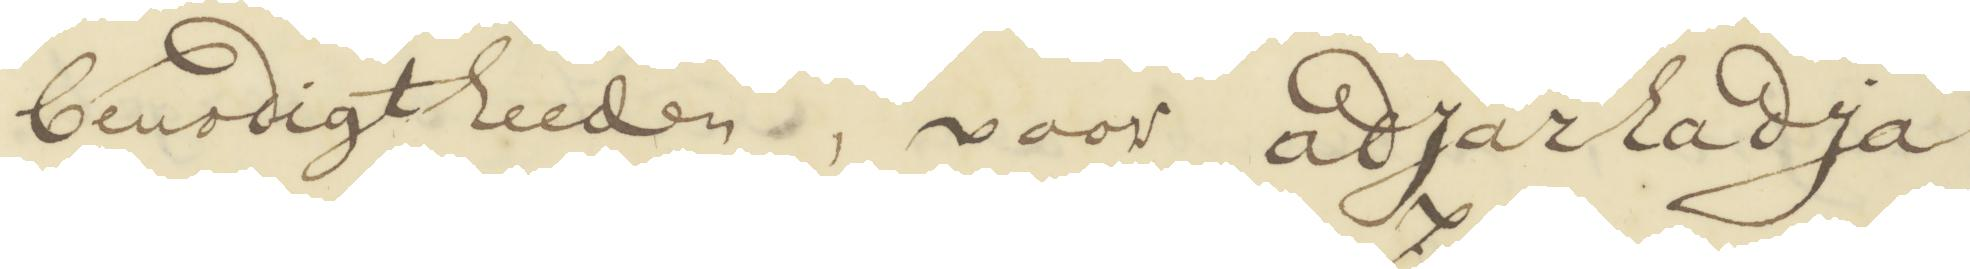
benodigtheeden, voor adjarhadja
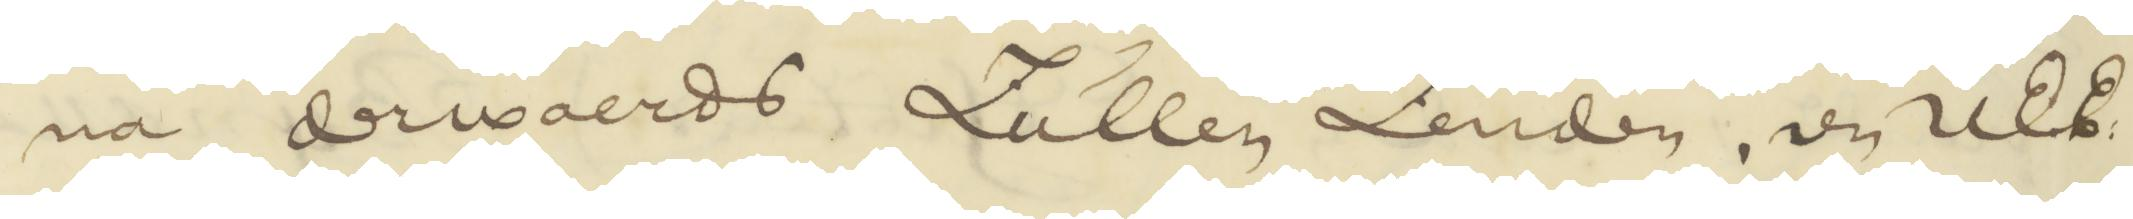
na derwaerds Zullen Zenden, en UEE:
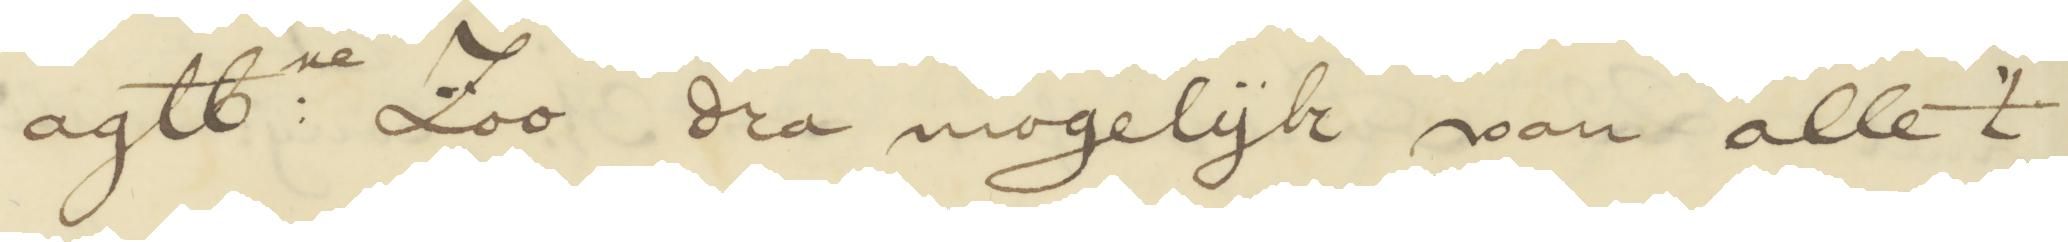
agtb:re Zoo dra mogelijk van alle ’t
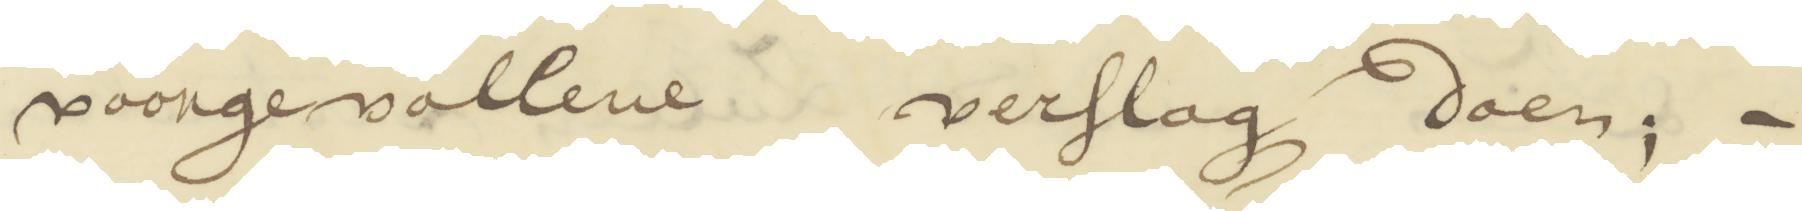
voorgevallene verslag doen; -
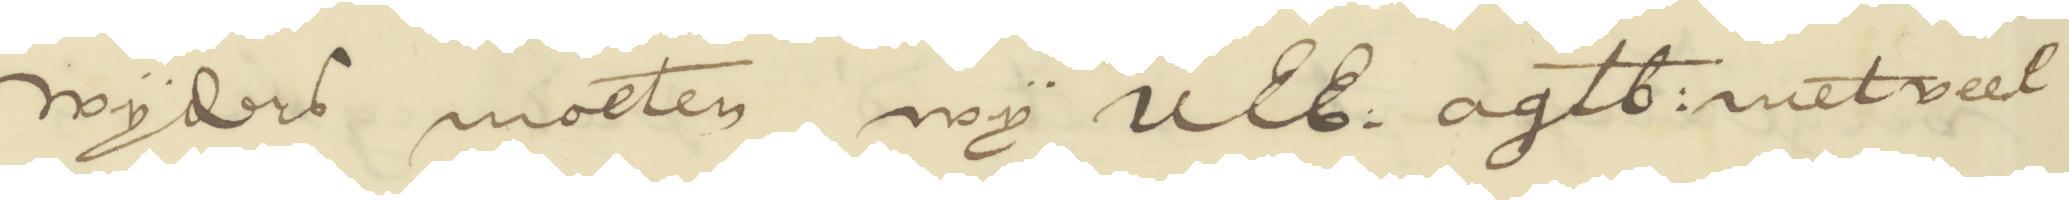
wijders moeten wij UEE: agtb: met veel
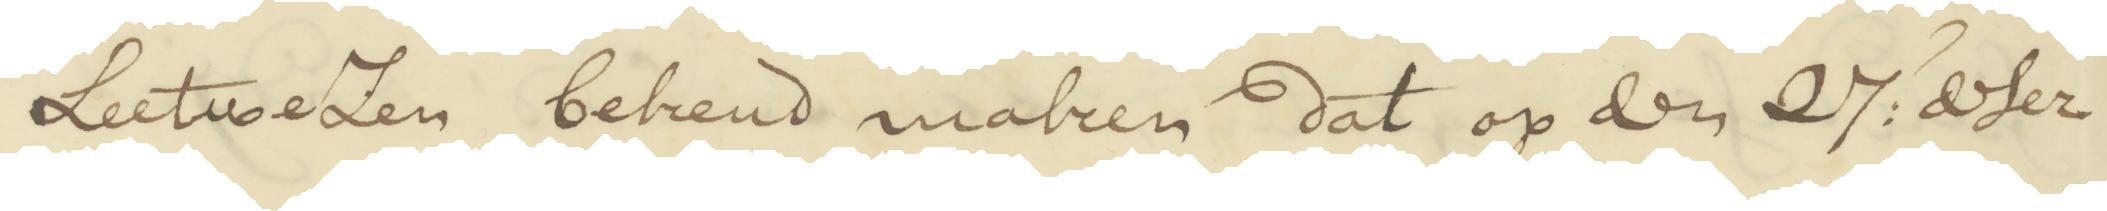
leetweZen bekend maken dat op den 27:' deser
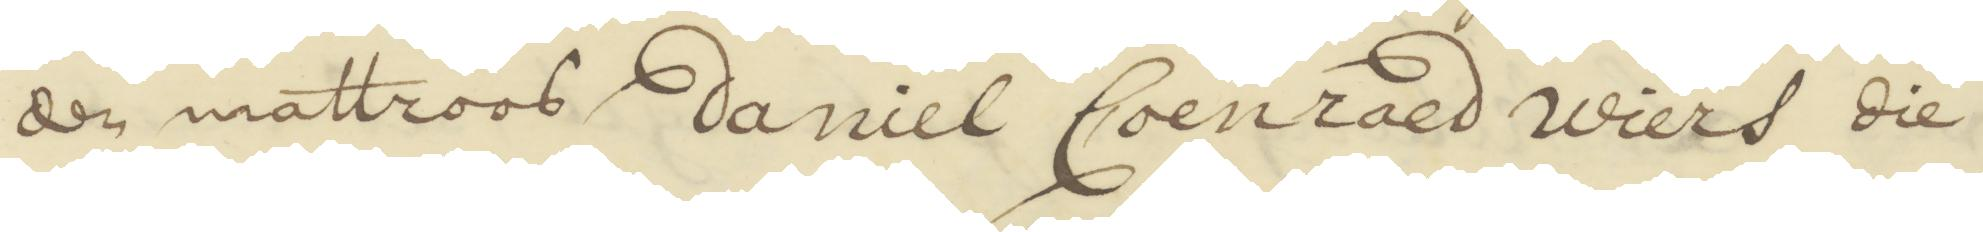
den mattroos daniel Coenraed wiers die
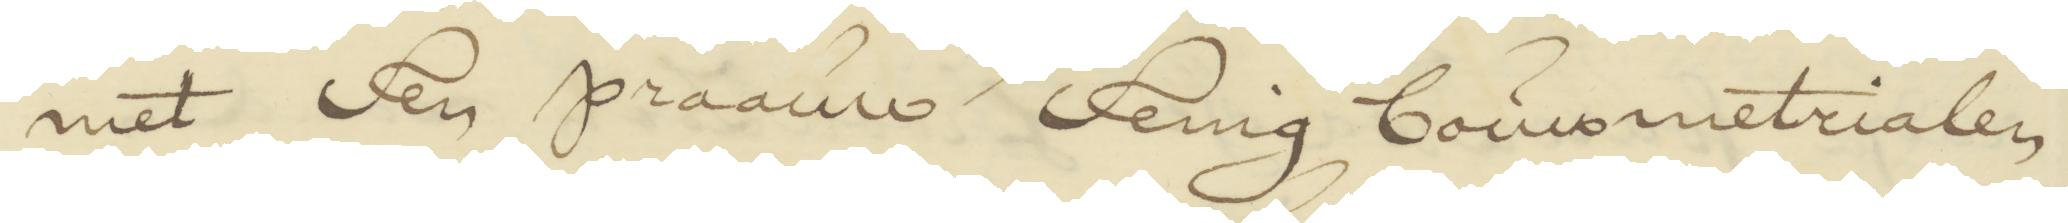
met Een praauw Eenig bouwmetrialen
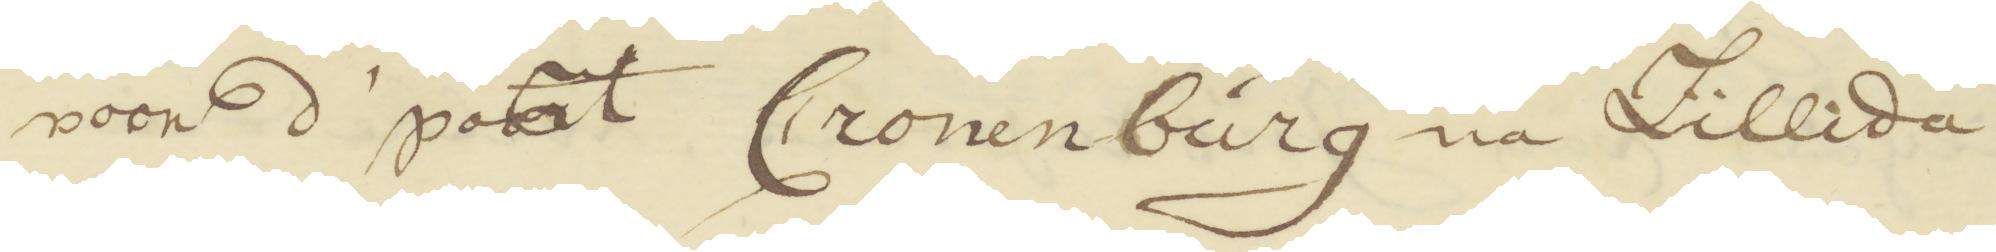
voor d’ post Cronenburg na Zillida
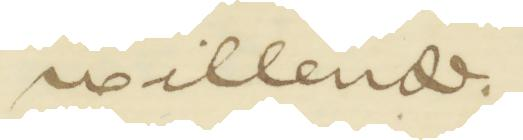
willende.
